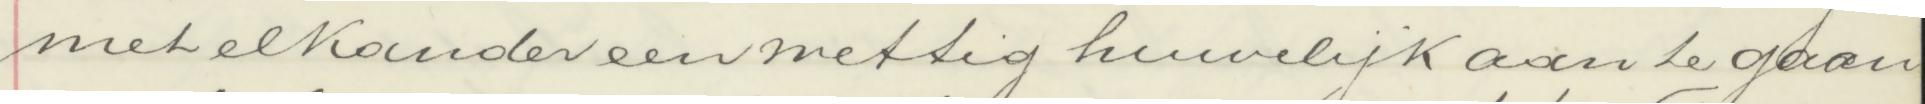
met elkander een wettig huwelijk aan te gaan
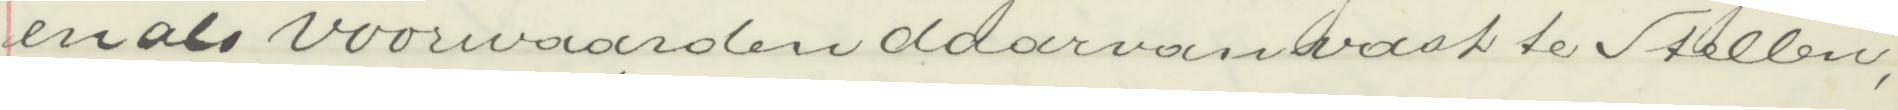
en als voorwaarden daarvan vast te stellen,
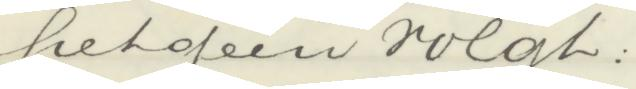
hetgeen volgt:
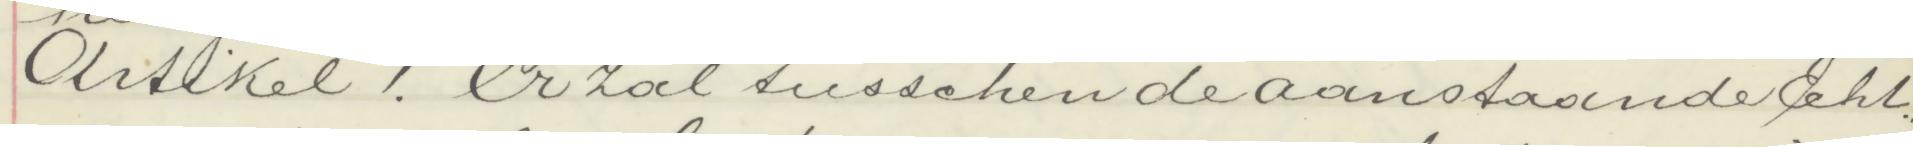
Artikel 1. Er zal tusschen de aanstaande Echt„
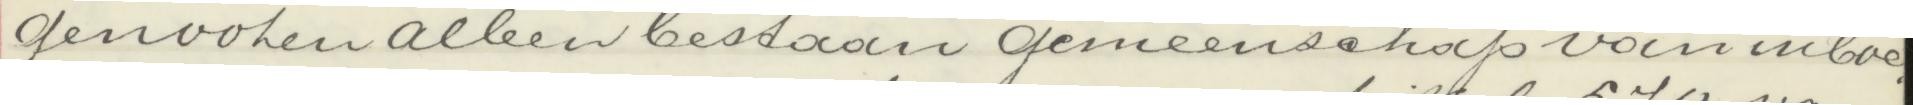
genooten alleen bestaan gemeenschap van inboe„
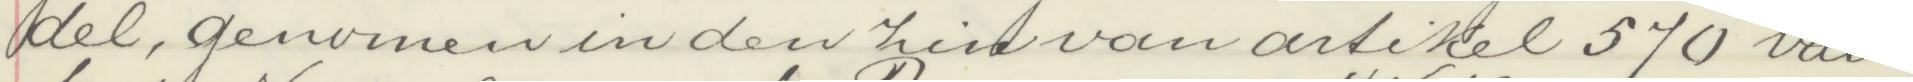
del, genomen in den zin van artikel 570 van
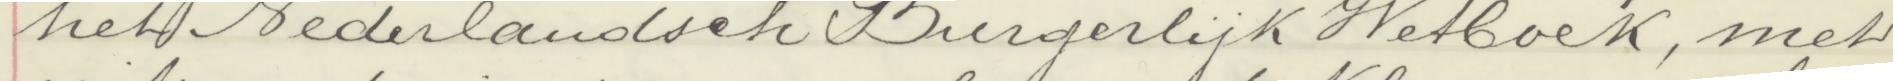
het Nederlandsch Burgerlijk Wetboek, met
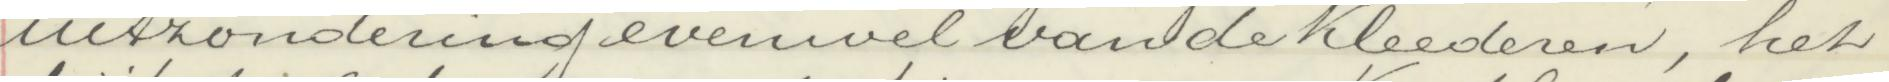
uitzondering evenwel van de kleederen, het
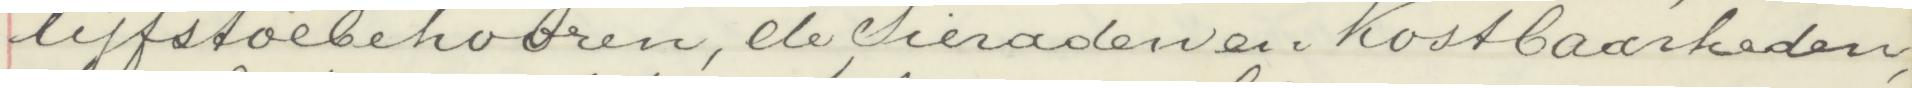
lijfstoebehooren, de Sieraden en kostbaarheden,
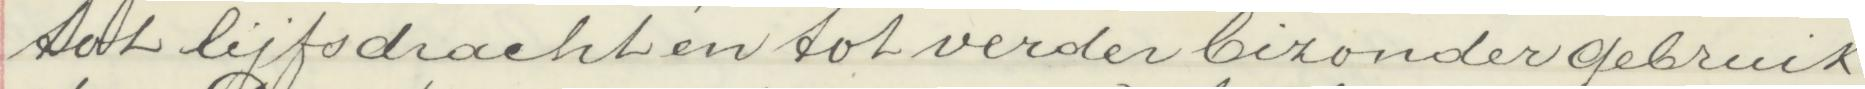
tot lijfsdracht en tot verder bizonder gebruik
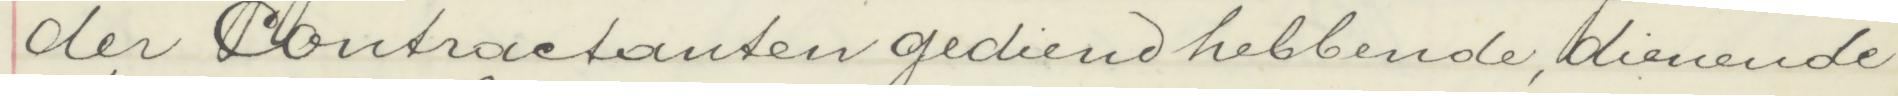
der Contractanten gediend hebbende, dienende
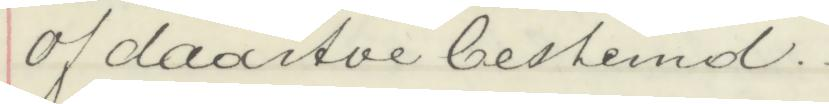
of daartoe bestemd.
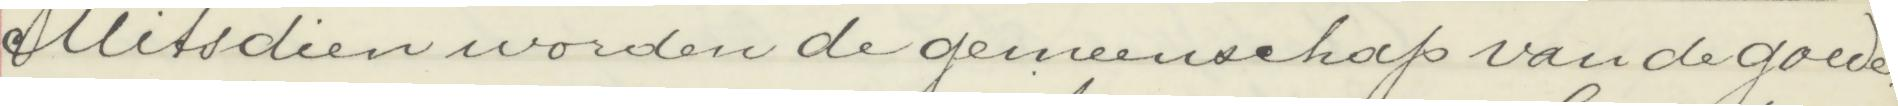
Mitsdien worden de gemeenschap van de goede
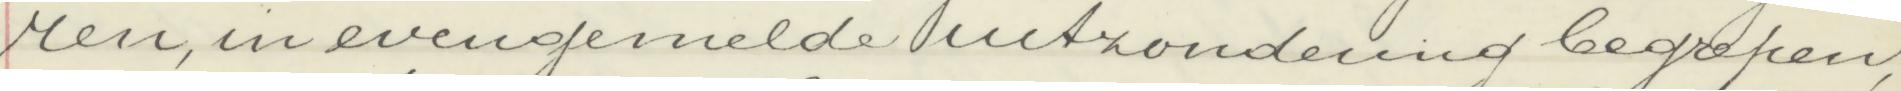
en, in evengemelde uitzondering begrepen,
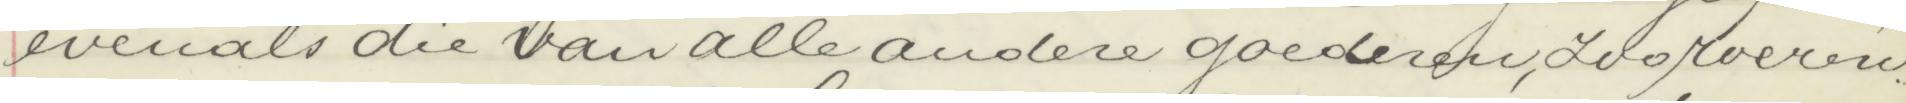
evenals die van alle andere goederen, zoo roeren„
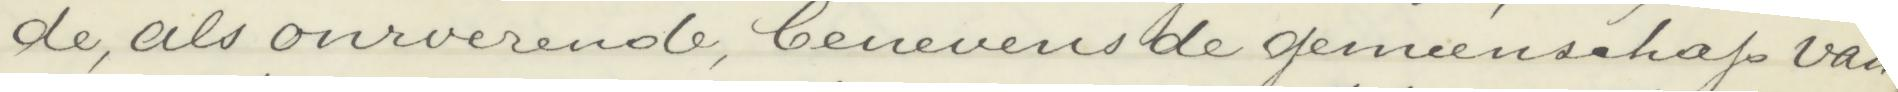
de, als onroerende, benevens de gemeenschap van
